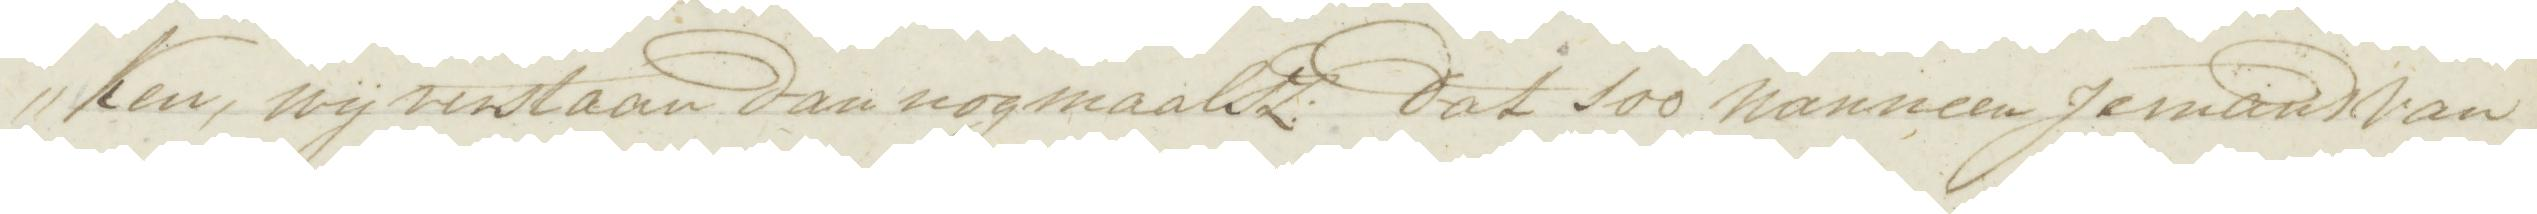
„ken, wij verstaan dan nogmaalsz: dat soo wanneer Jemand van
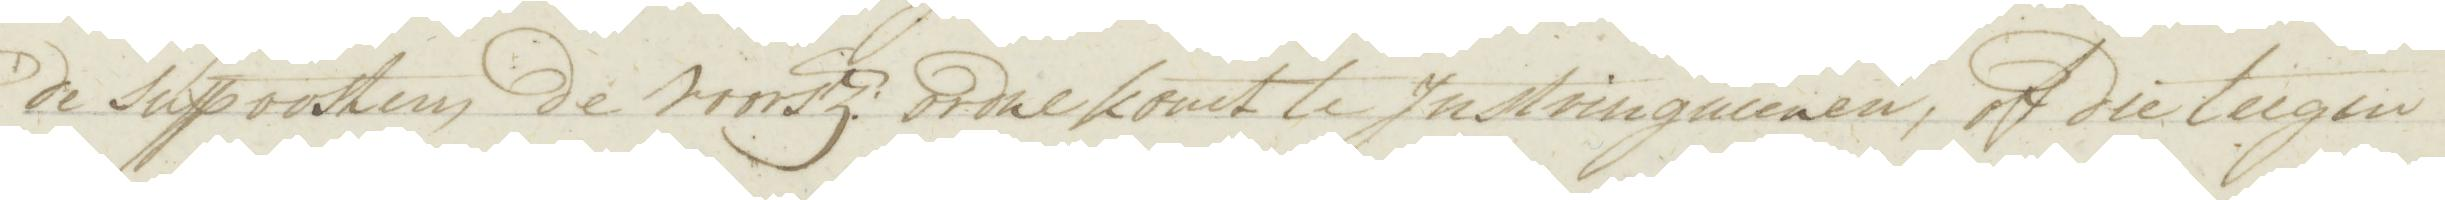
de suppoosten, de voorsz: ordre komt te Jnstringueeren, of die teegen
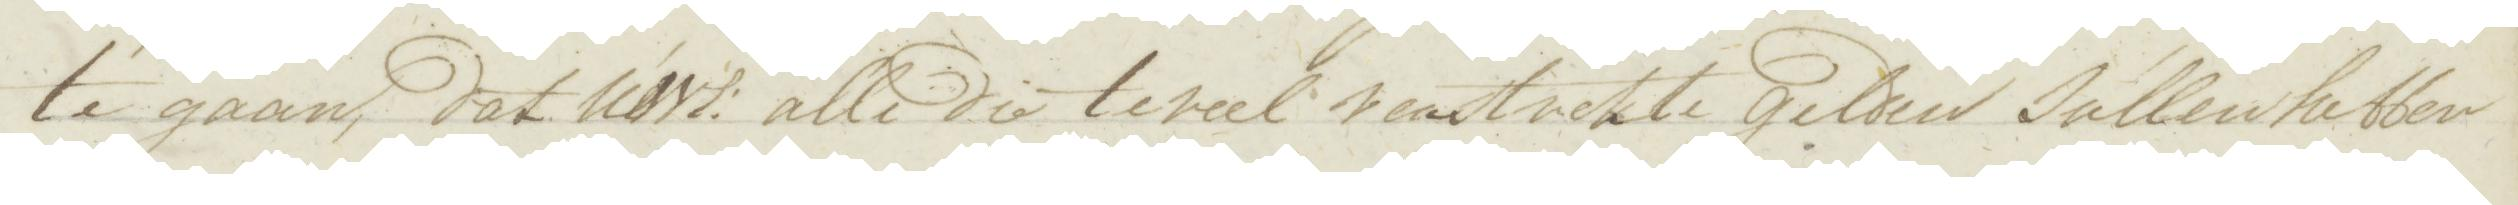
te gaan, dat uwE: alle die teveel verstrekte gelden sullen hebben
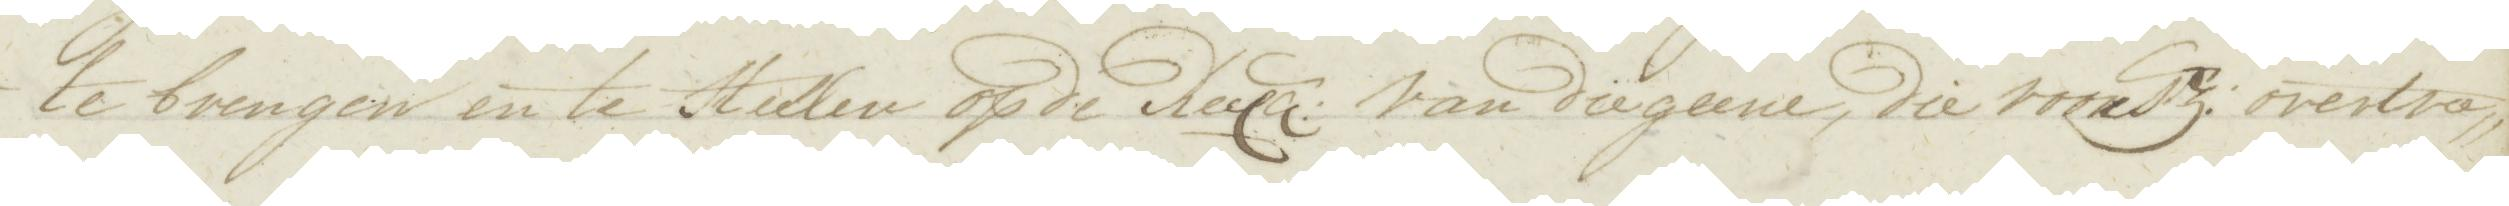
te brengen en te stillen op de Reecq: van die geene, die voorsz: overtra„
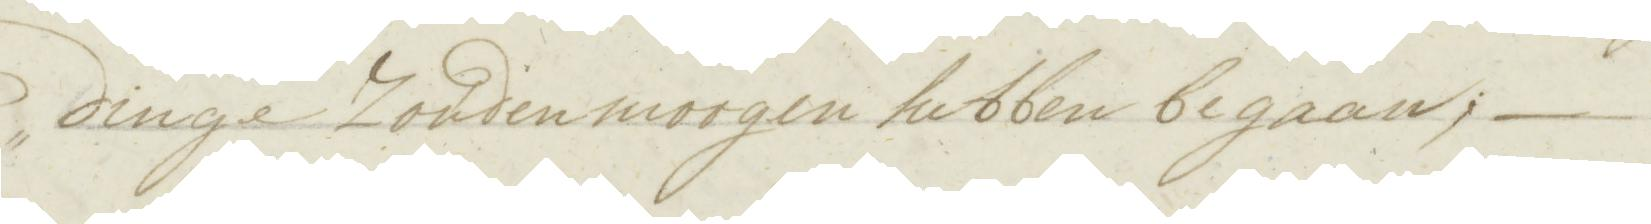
„dinge zouden moogen hebben begaan; —
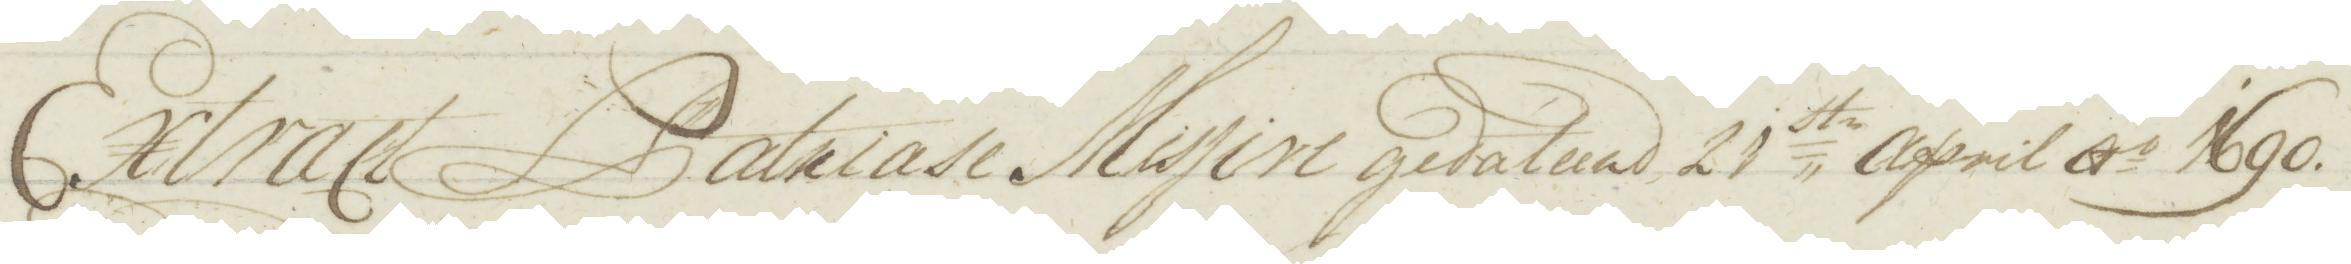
Extract Patriase Missive gedateerd 21„str april a=o 1690.
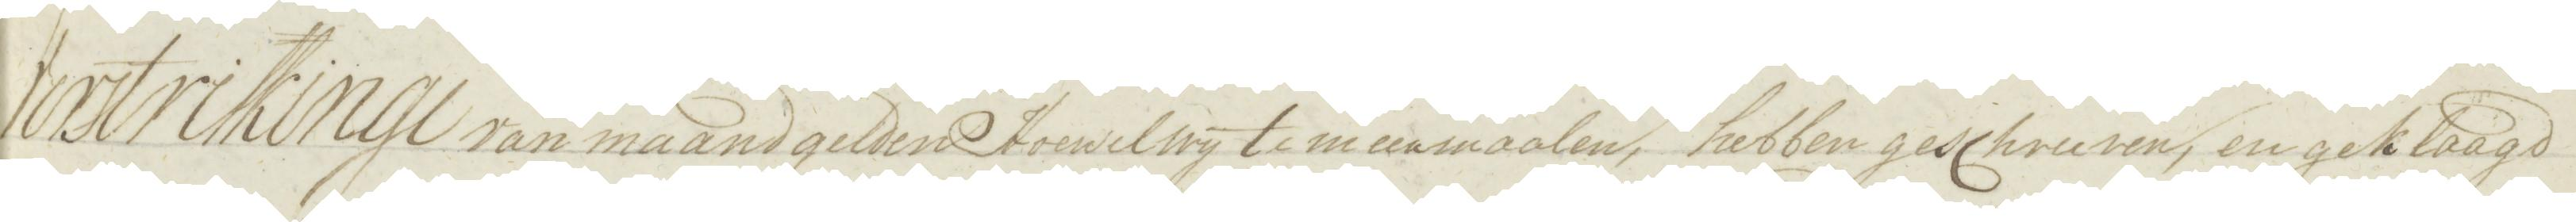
Verstrikkinge van maand gelden Hoewel wij te meermaalen, hebben geschreeven, en geklaagd
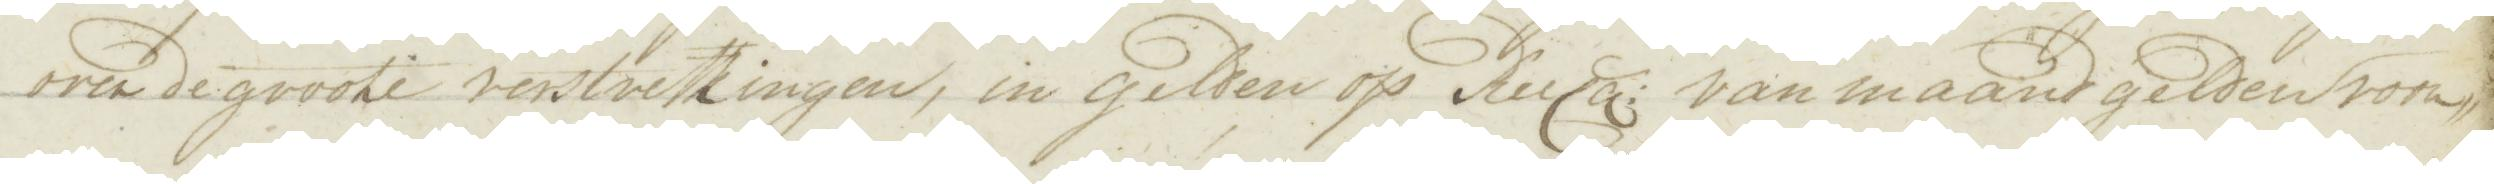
over de groote verstrekkingen, in gelden op Reecq: van maand gelden voor„
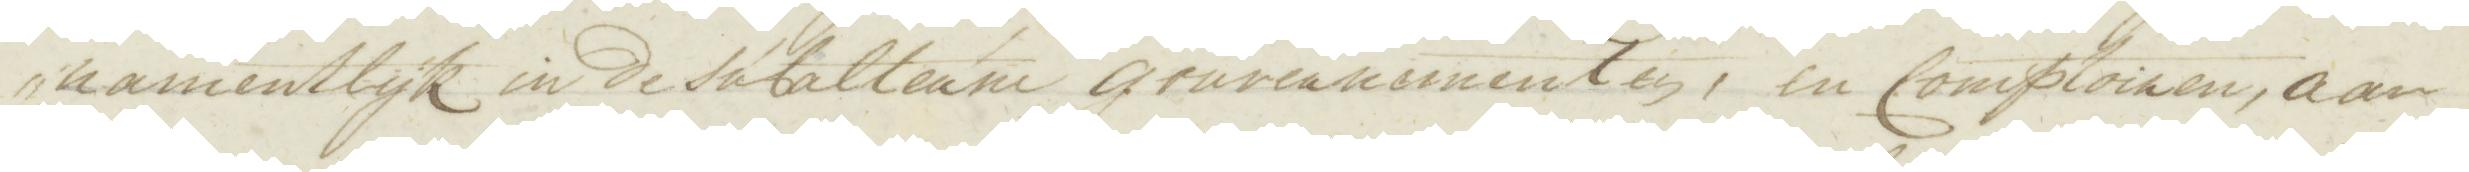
„namentlijk in de subalteure gouvernementen, en Comptoiren, aan
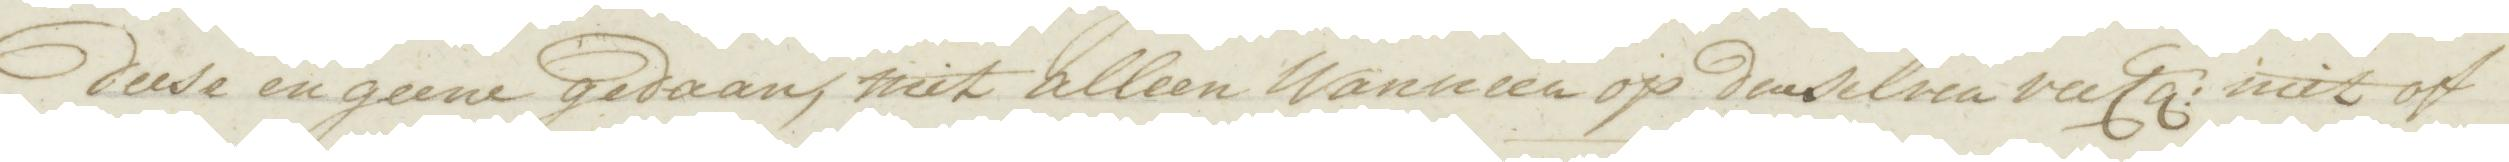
deese en geene gedaan, niet alleen wanneer op derselven reecq: niet of
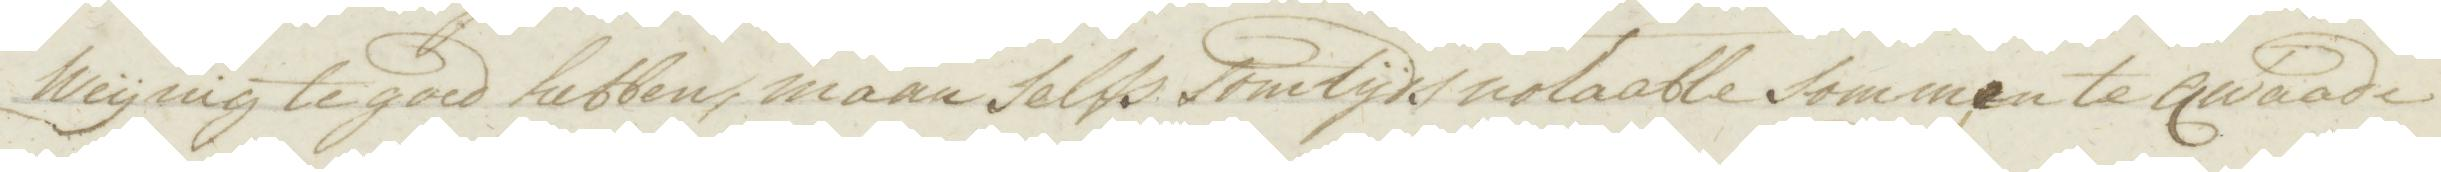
weijnig te goed hebben, maar selfs somtijds notaable sommen te qwaade
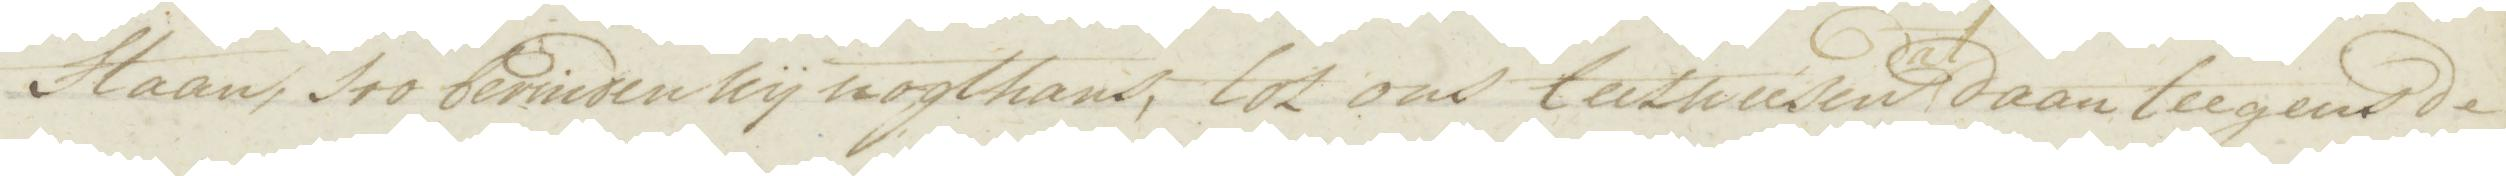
staan, soo bevinden wij nogthans, tot ons leetweesen daar teegens de
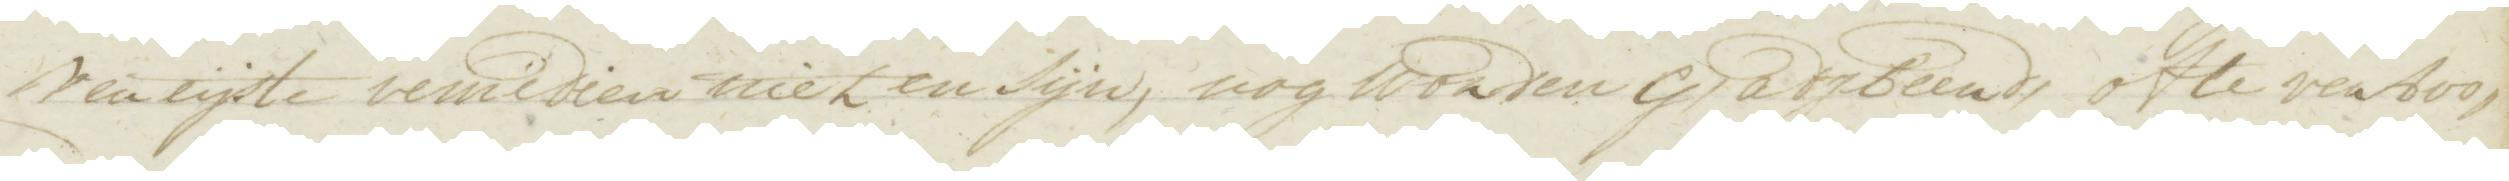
vereijste remedien niet en sijn, nog worden g'adjbeerd, ofte verboo
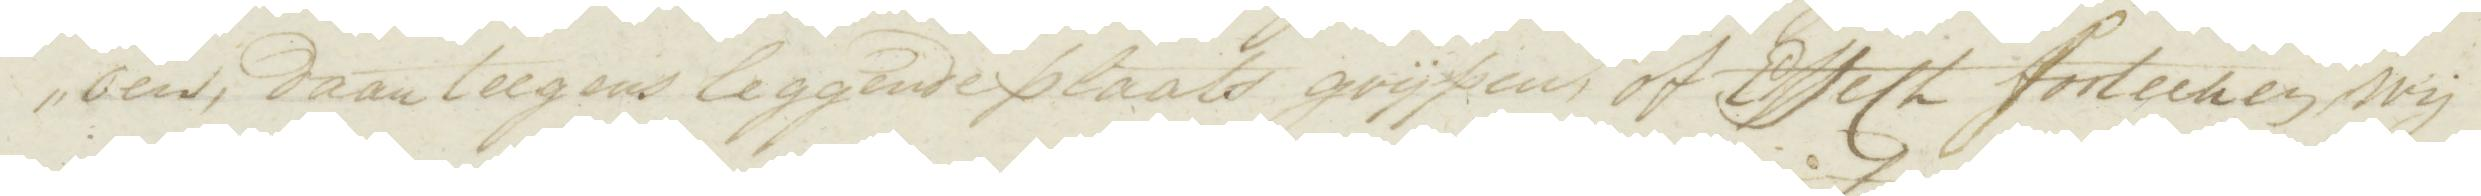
„ben, daar teegens leggende plaats grijpen, of Effect sorteeren wij
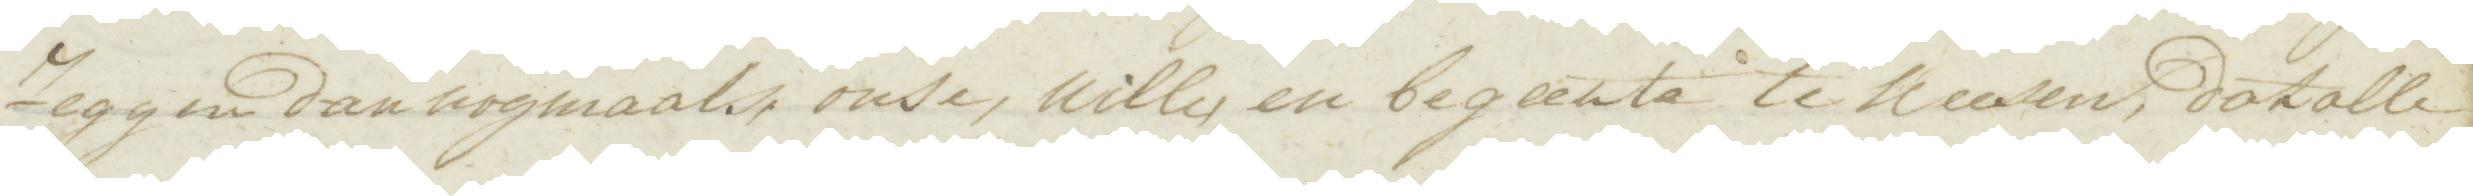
zeggen dan nogmaals, onse, wille, en begeerte te weesen, dat alle
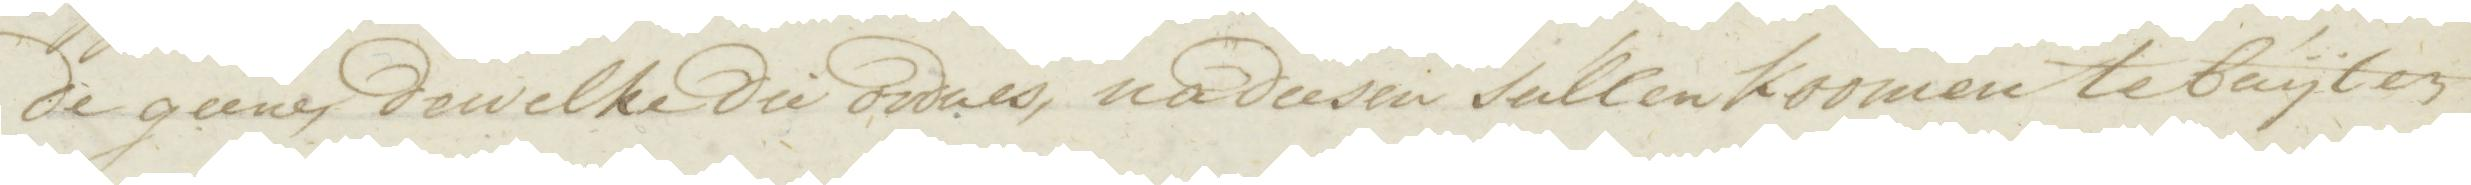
de geenen dewelke die ordres, na deesen sullen koomen tebuijten
